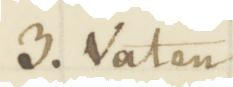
3. Vaten
